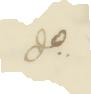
d.o
